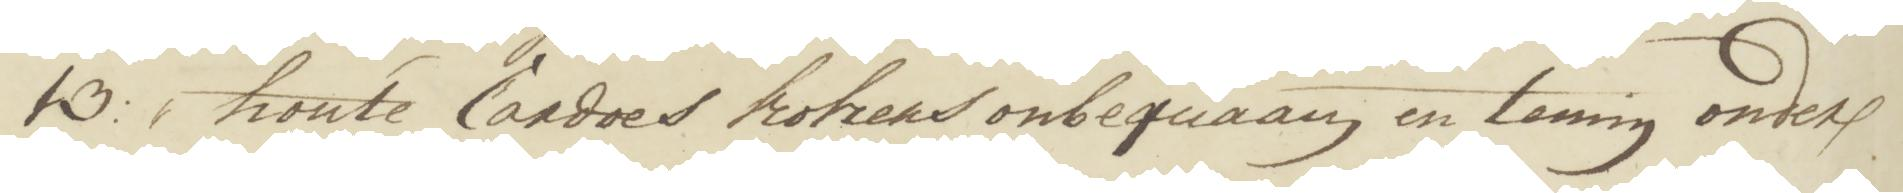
13: „ houte Cordoes kokers onbequaam en temin onder
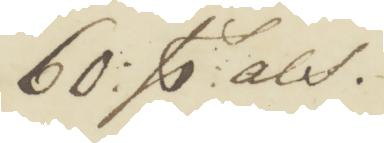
60: p:s als.
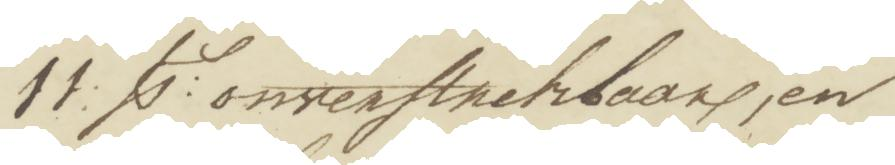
11: p:s onverstrekbaar, en
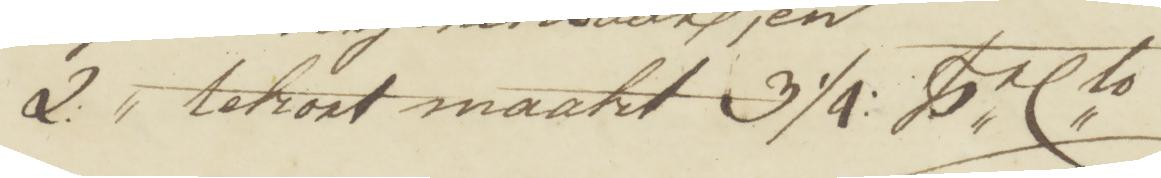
2: „ tekort maakt 3¼: p„r C„to
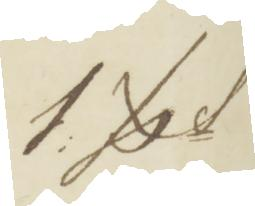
1. p=s
